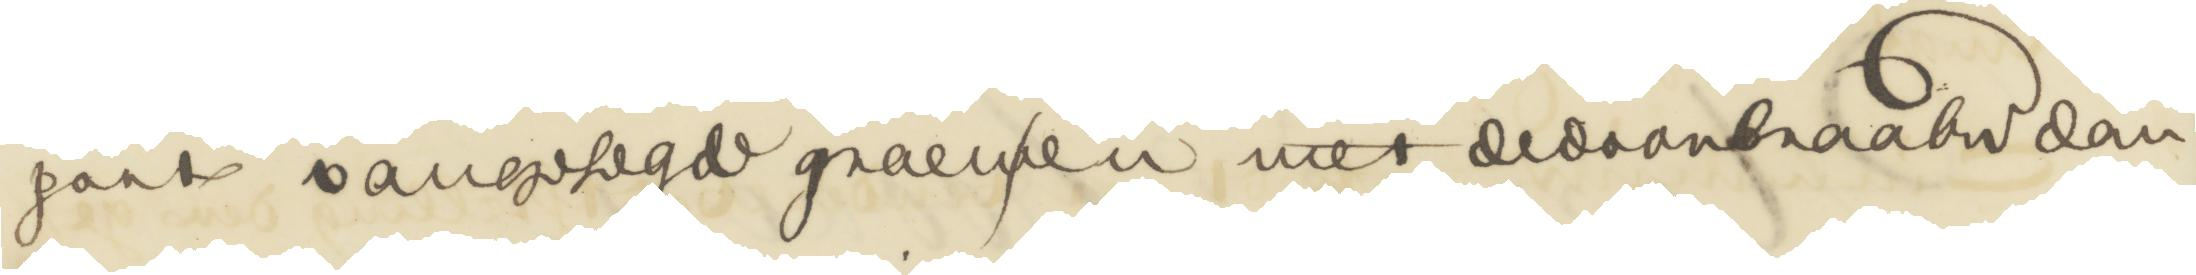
port van gesegde graennen met de doorbraake dan
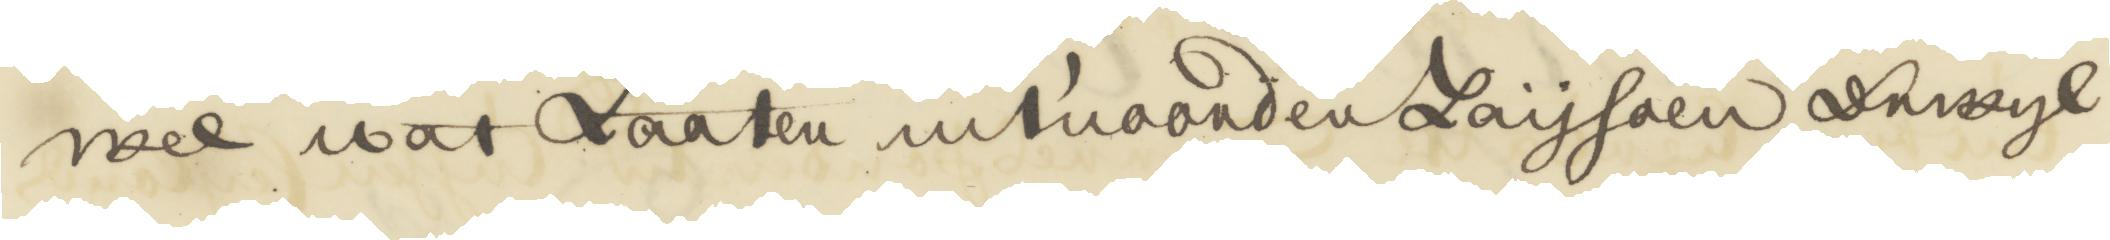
wel wat Laater int'noorden Zaijsoen terwyl
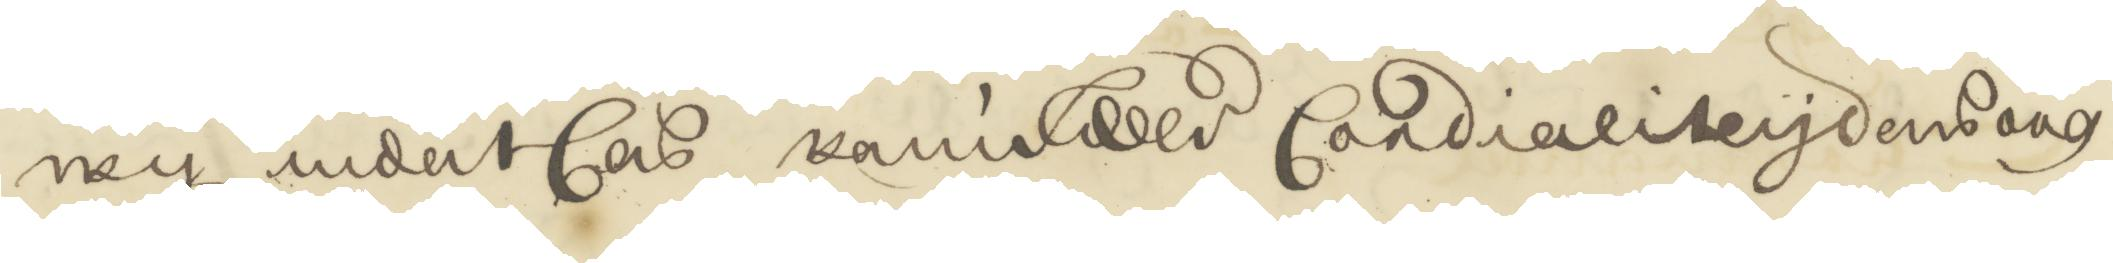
wij in dat Cas van uEdele Cordialiteijd en sorg
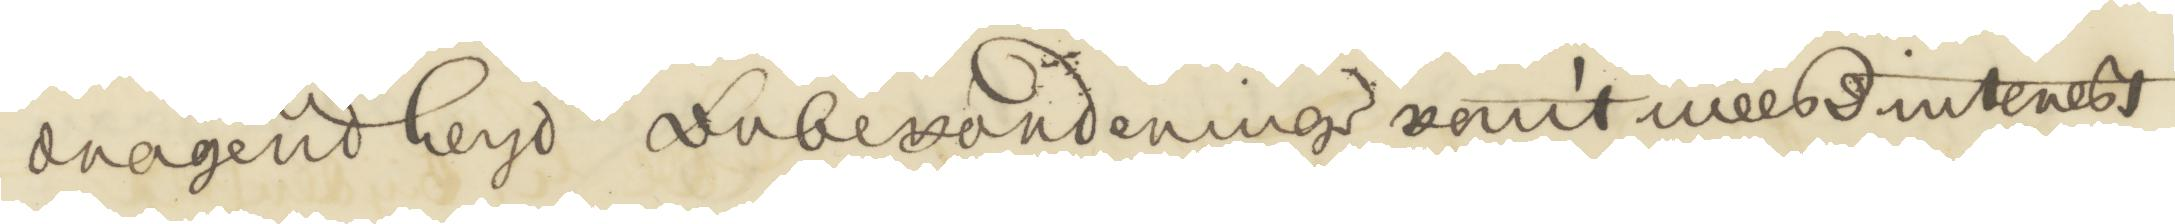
dragendheyd ter bevorderinge van ’t meeste interest
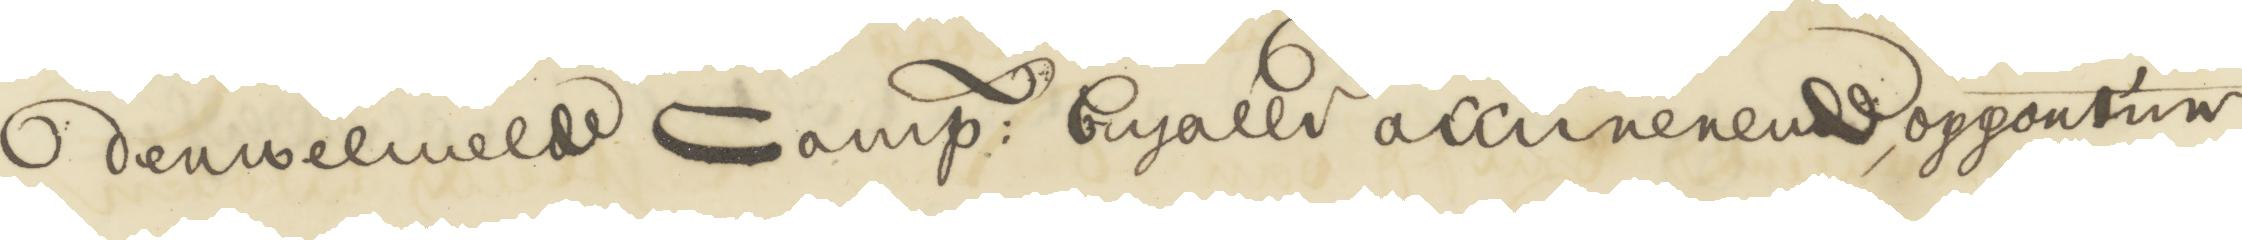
derwelmelde Comp:s by alle accurerende opportune
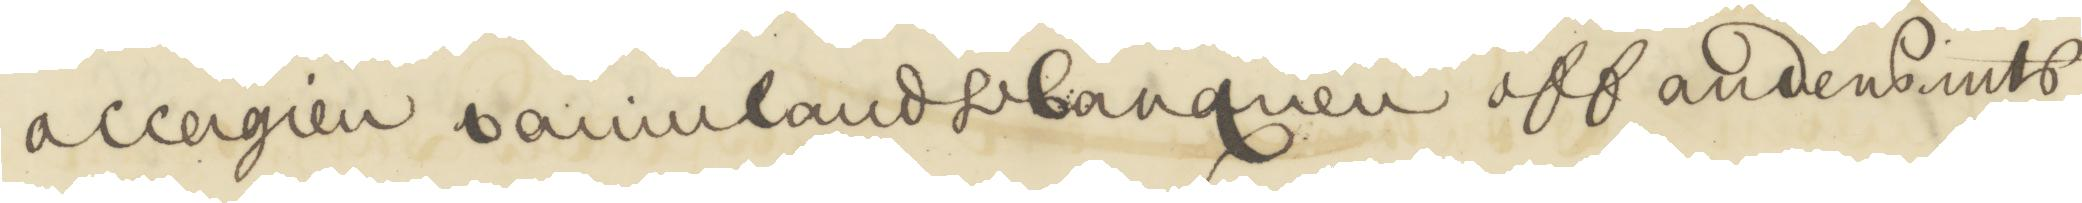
occagien van inlandse barquen off andersints
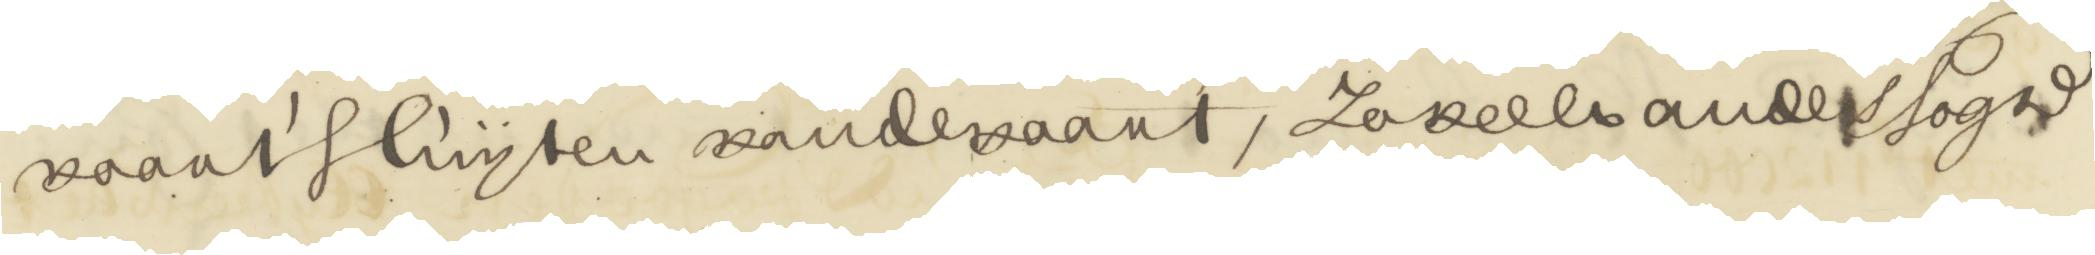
voor t' sluijten van de vaart, zowell vande versogte
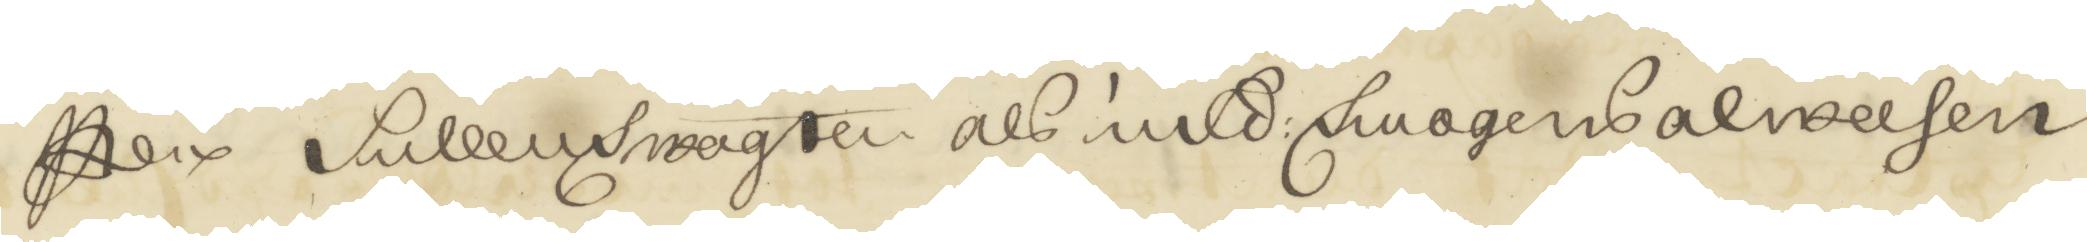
peper Sullen verwagten als uEd: vermogens alweesen
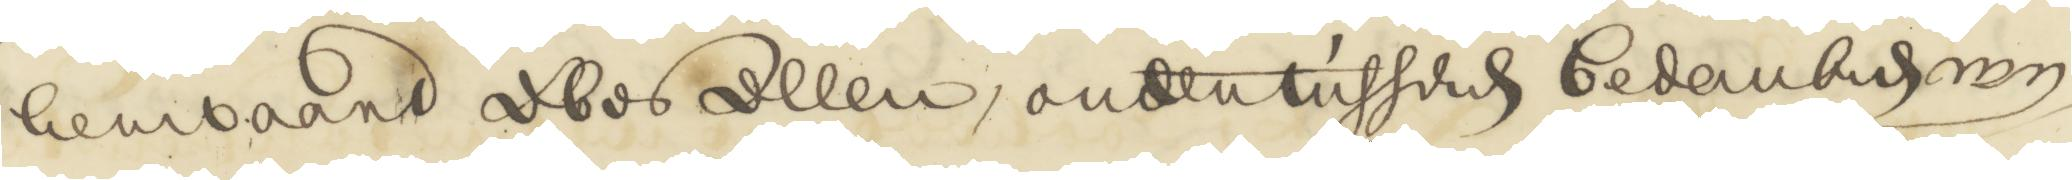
herwaard tebestellen, ondertusschen bedanken wy
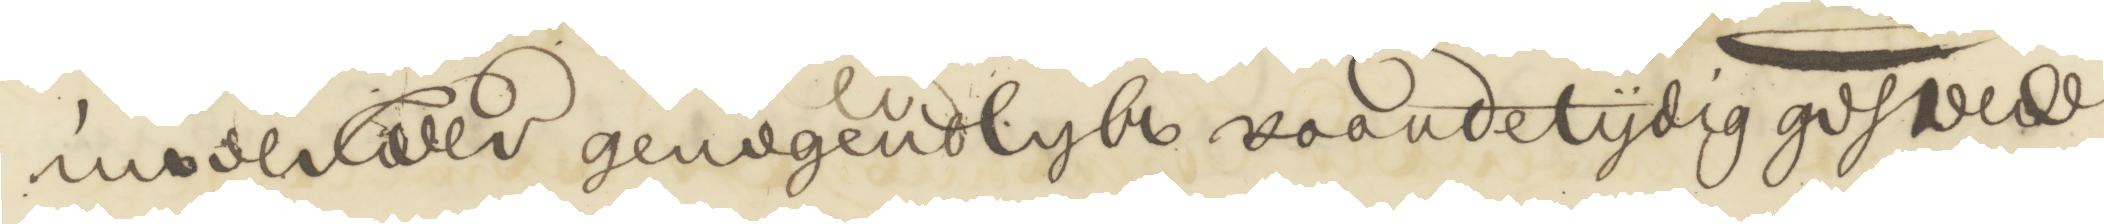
uwel Edele genegendlyk voorde tijdig gestelde
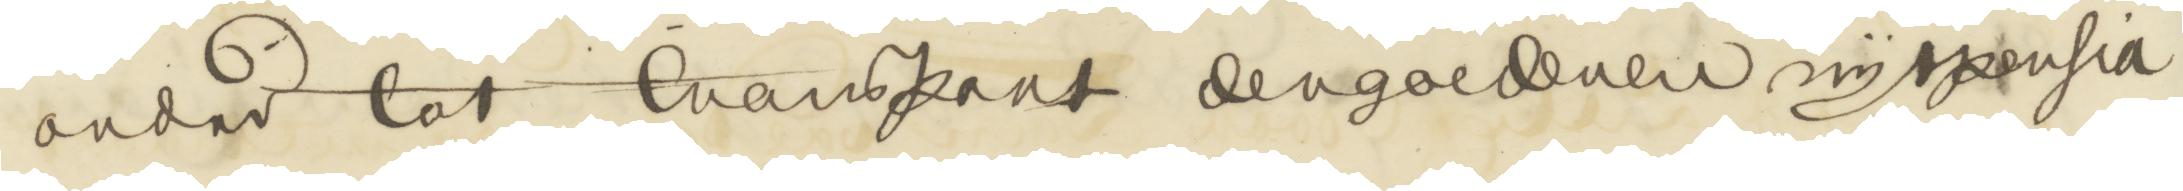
ordre tot transport der goederen uijt persia
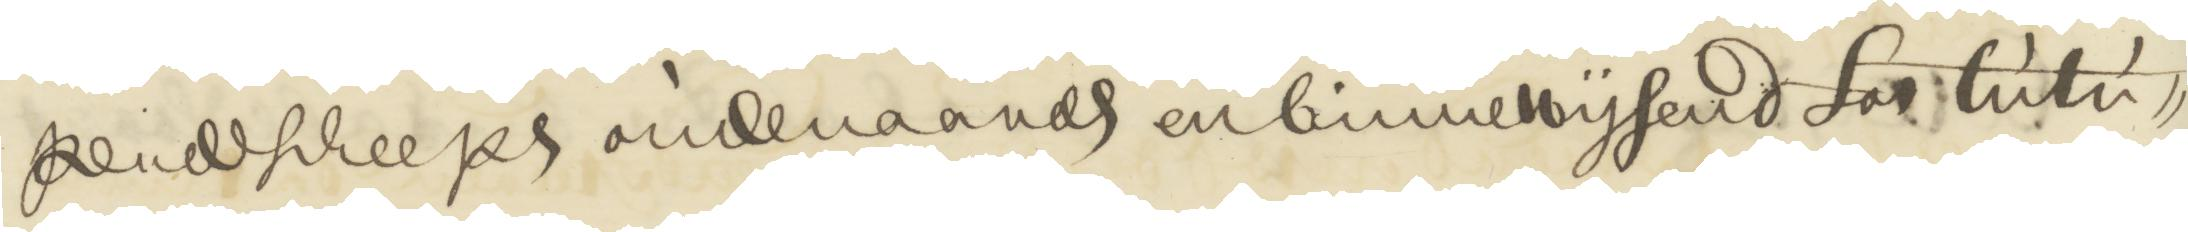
per de scheepen oudenaarden en binnewijsend tot tutu„
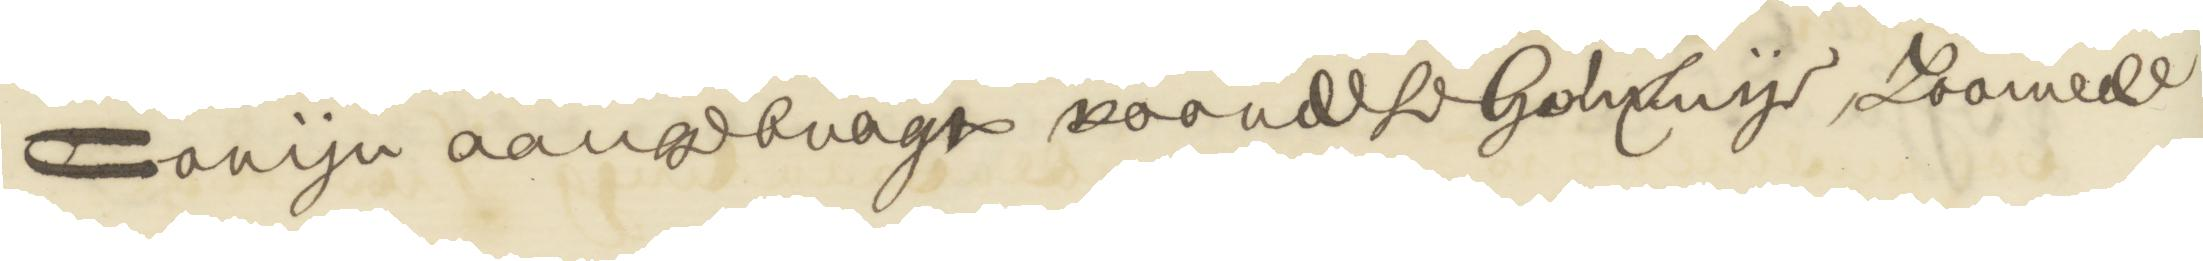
Corijn aangebragt voor dese Gouvernije, Zoomede
